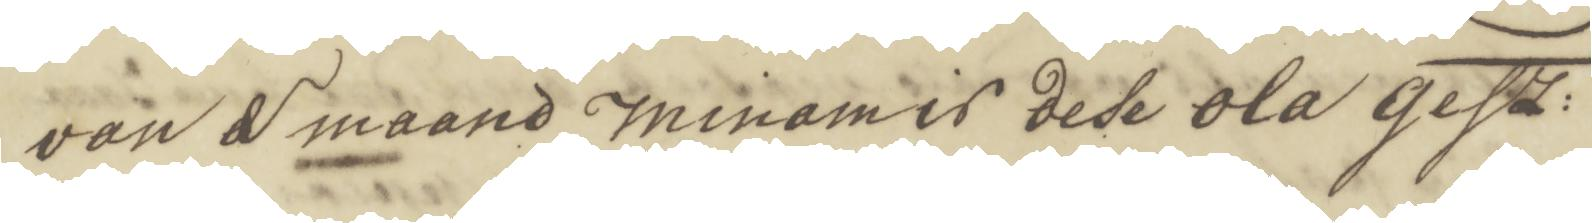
van de maand minam is dese ola gesz:
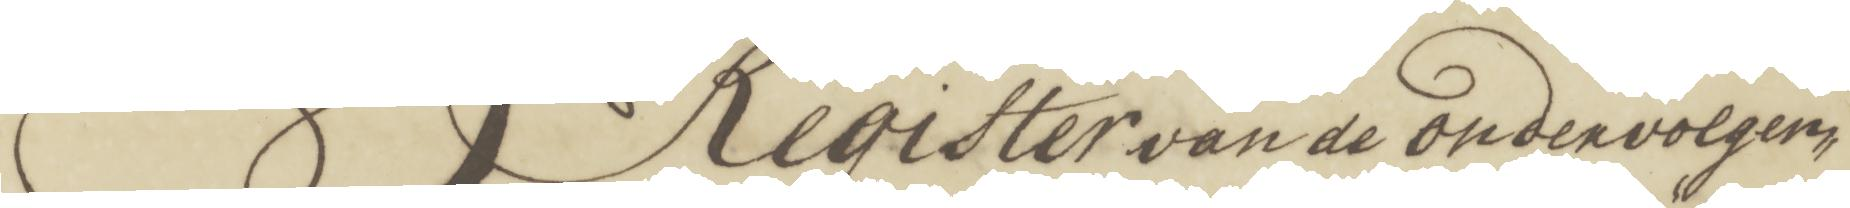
Register van de ondervolgen„
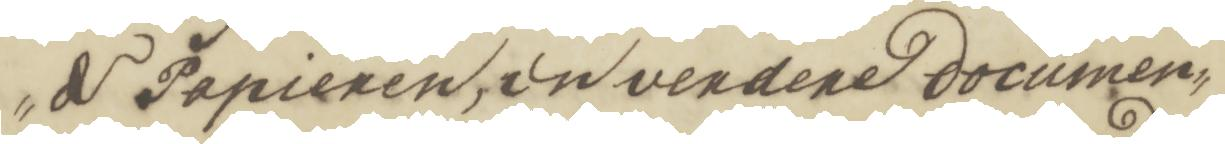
„de Papieren, en verdere documen„
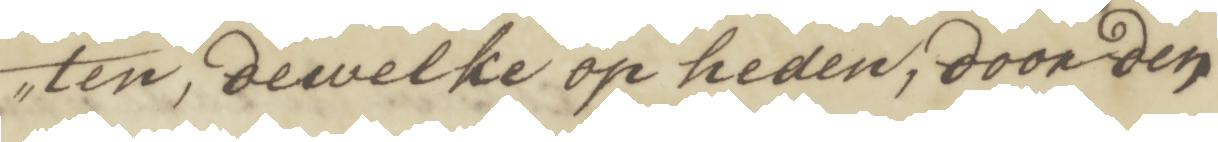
„ten, dewelke op heden, door den
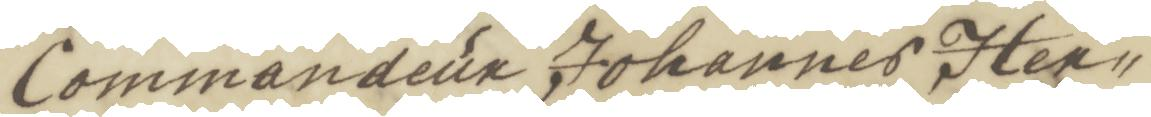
Commandeur Iohannes Her„
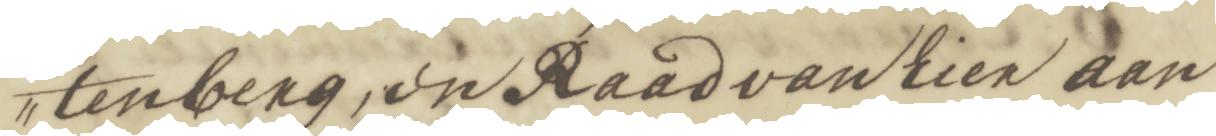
„tenberg, en Raad van hier aan
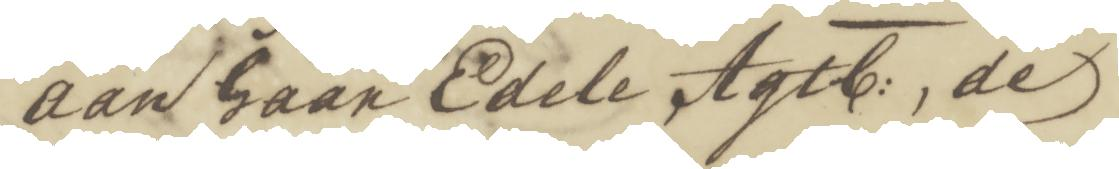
aan haar Edele Agtb:, de
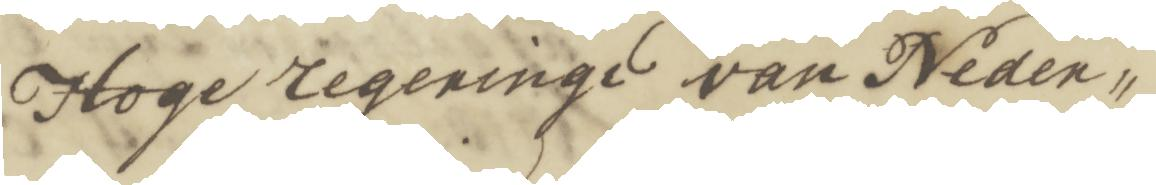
Hoge regeringe van Neder„
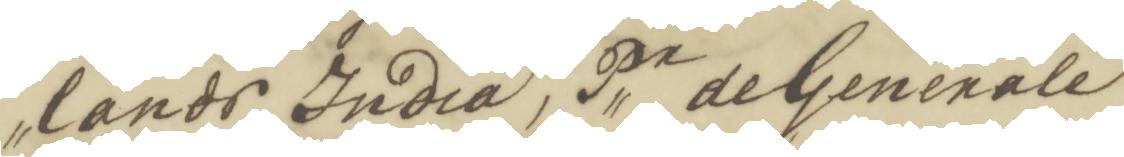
„lands India, P„r de Generale
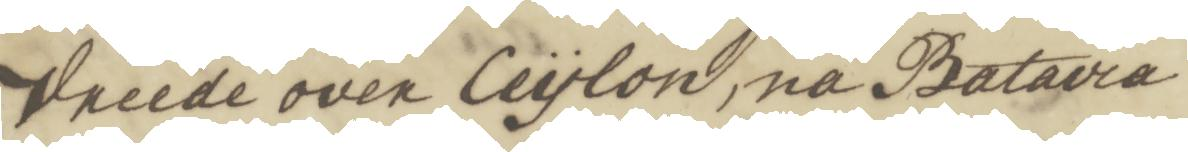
Vreede over Ceijlon, na Batavia
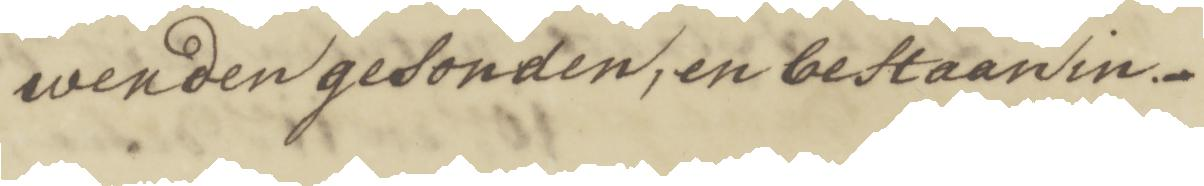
werden gesonden, en bestaan in._
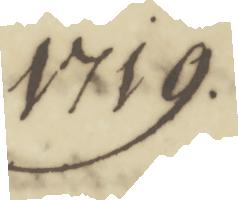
1719.
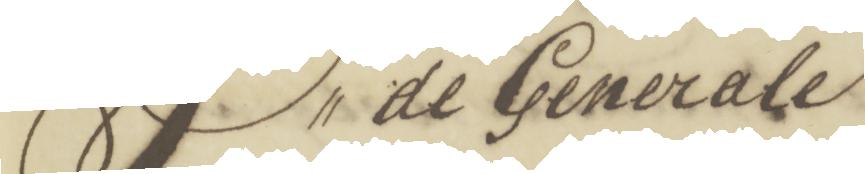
P„r de Generale
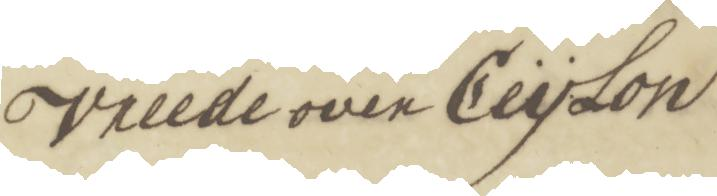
vreede over Ceijlon
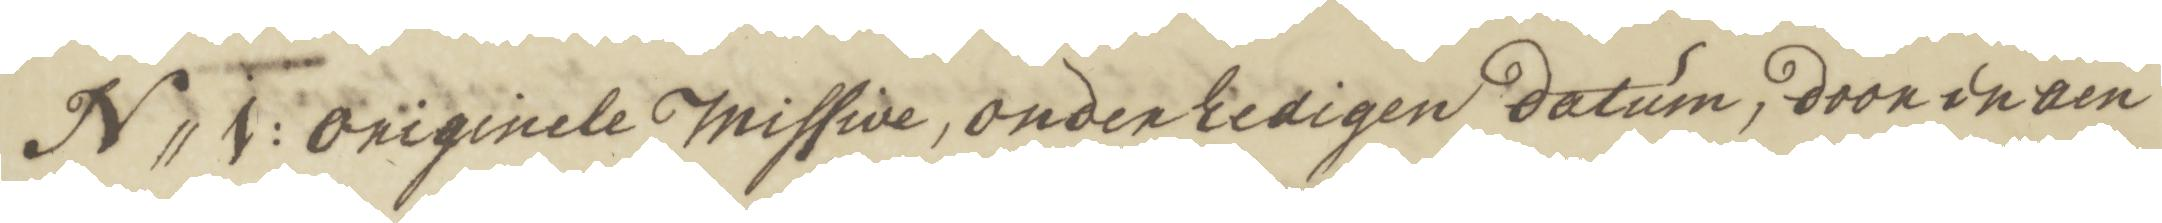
N„o 1: Originele missive, onder hedigen datum, door en aen
